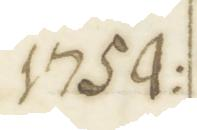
1754:
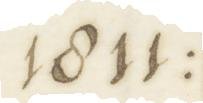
1811:
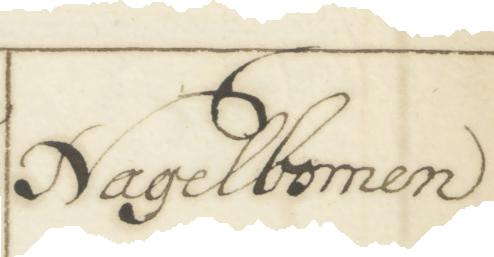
Nagelbomen
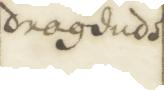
dragende
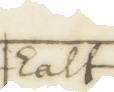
half
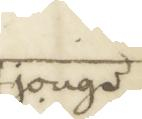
jonge
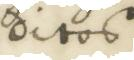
ditos
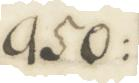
450:
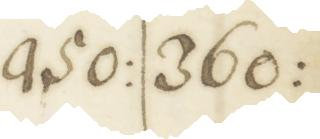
450: 360:
